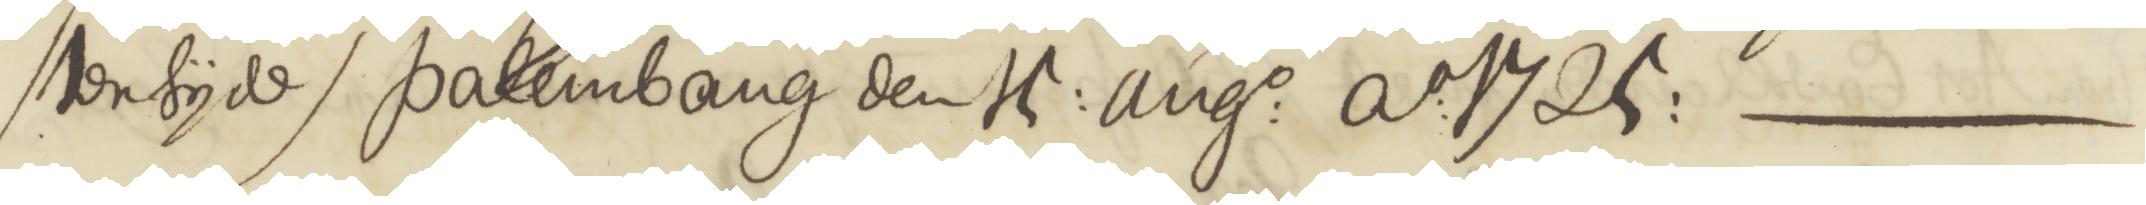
/tersijde/ Palembang den 15: Aug:o A:o 1725: —
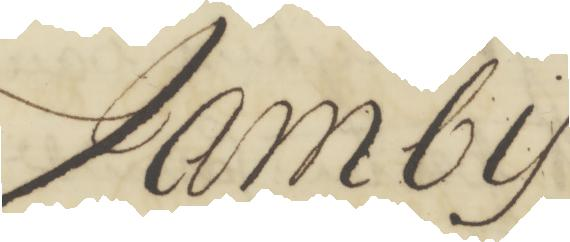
Jambij
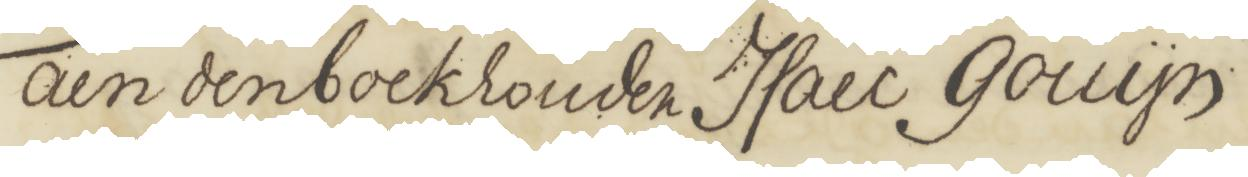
aen denboekhouder Jsaec Gouijn
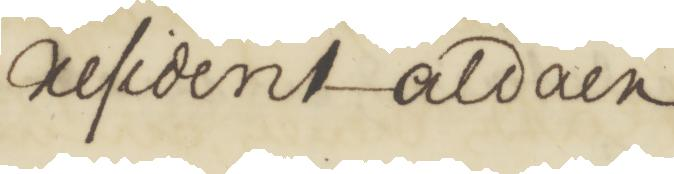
resident aldaer
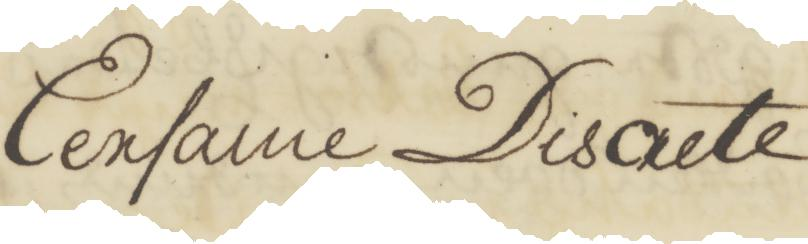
Eersame Discrete
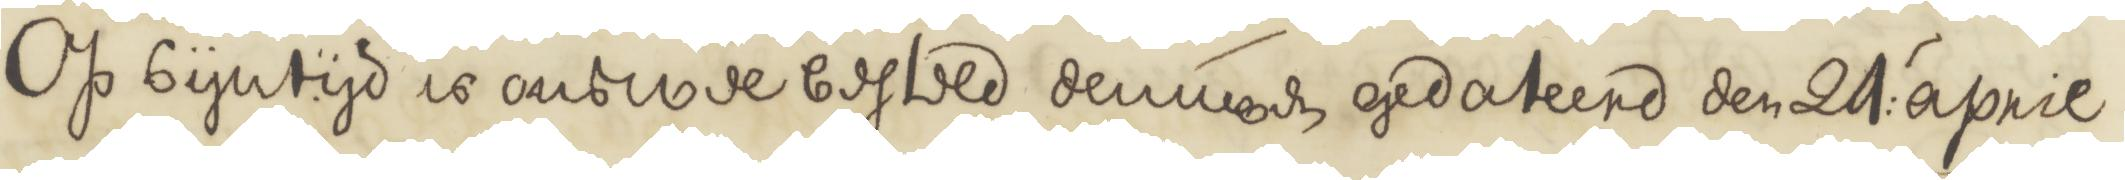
Op sijntijd is onswel besteld denuwen gedateerd den 24:' april
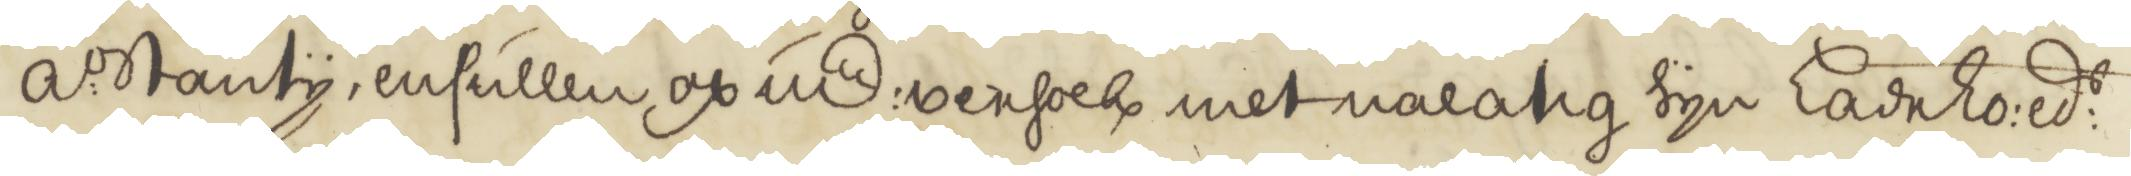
A:o stantij, ensullen op uE: versoek niet nalatig sijn haerho: ed:s
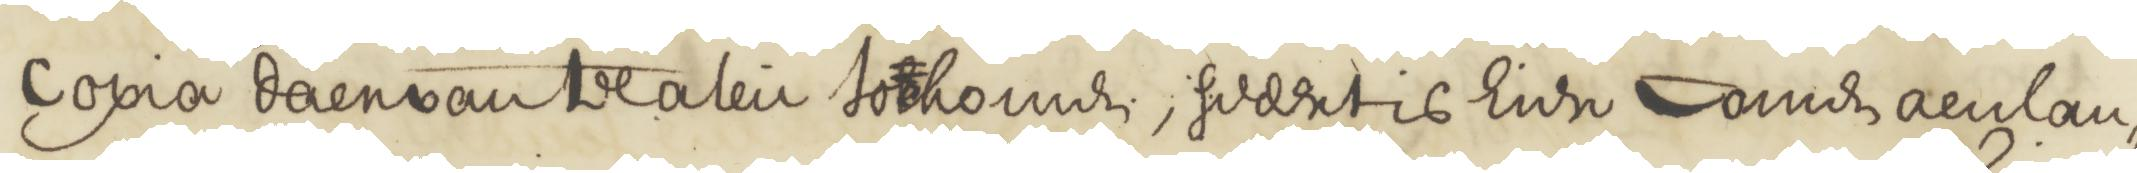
Copia daervan telaten toekomen; sedertis hier comen aenlan„
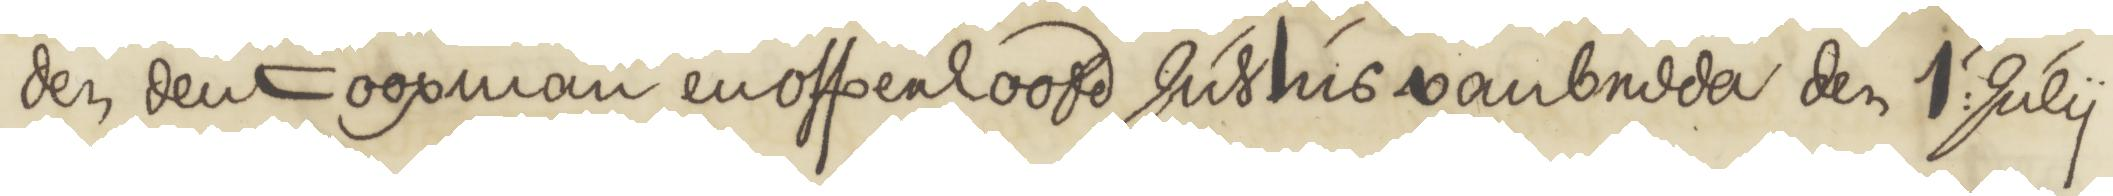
den den coopman enopperhoofd Justus van breda den 1:' Julij
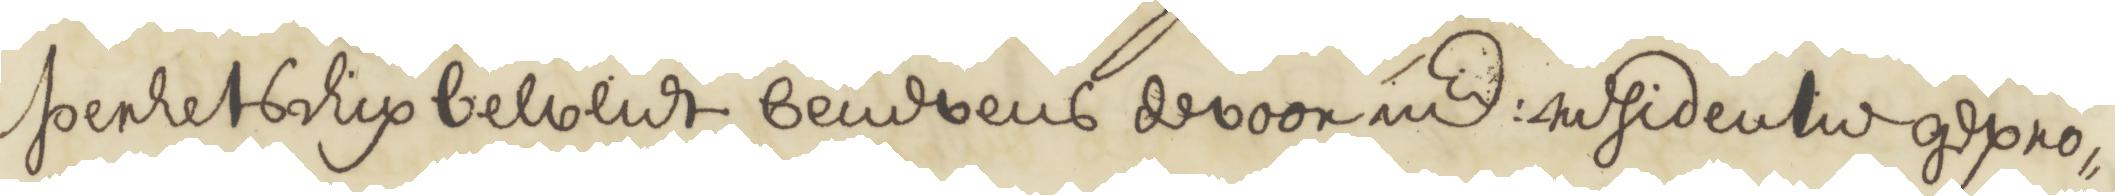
Perhetschip belvliet benevens devoor uE: residentie gepro„
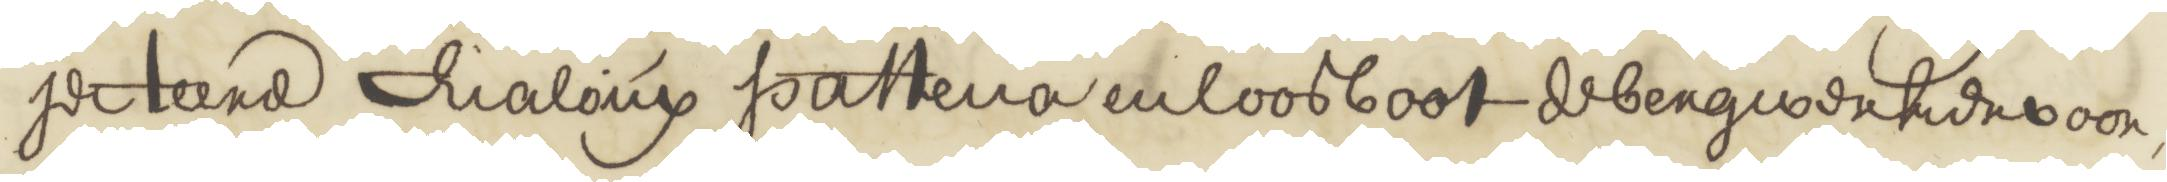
jecteerd chialoup pattena enloosboot debergwerkervoor,
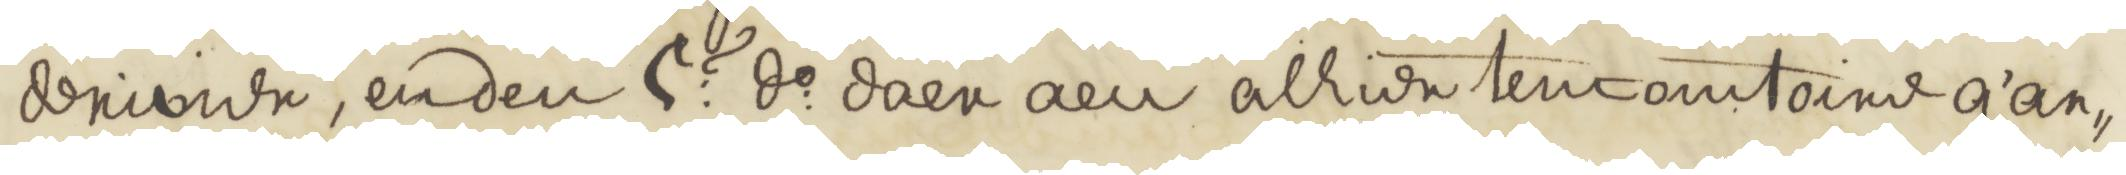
derivier, en den 5': d:o daer aen alhier tencomtoire g’ar„
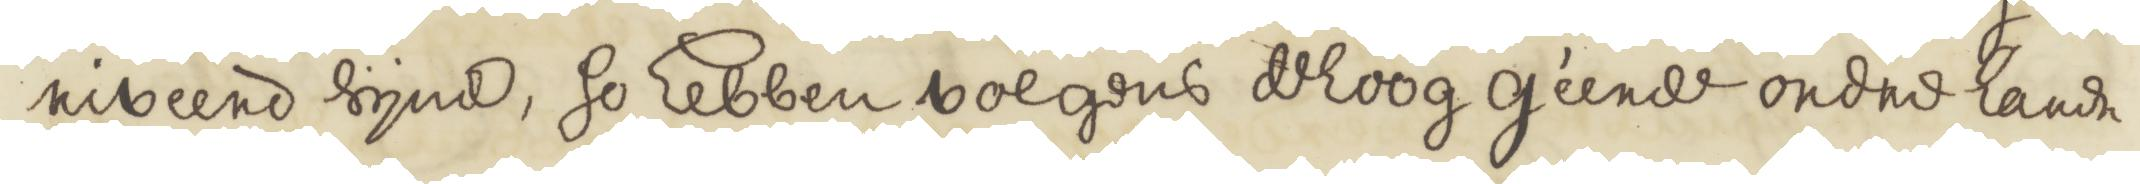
riveerd sijnde, so hebben volgens dehoog g'eerde ordre haren
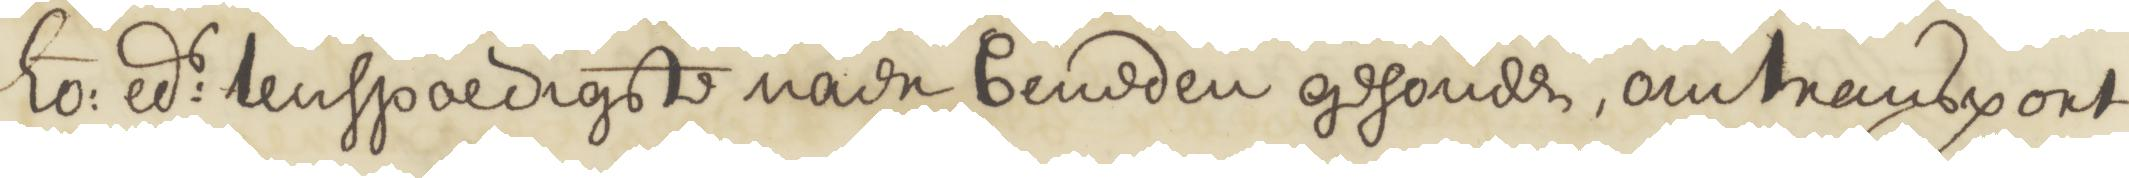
ho: ed:s tenspoedigste naer beneden gesonden, omtransport
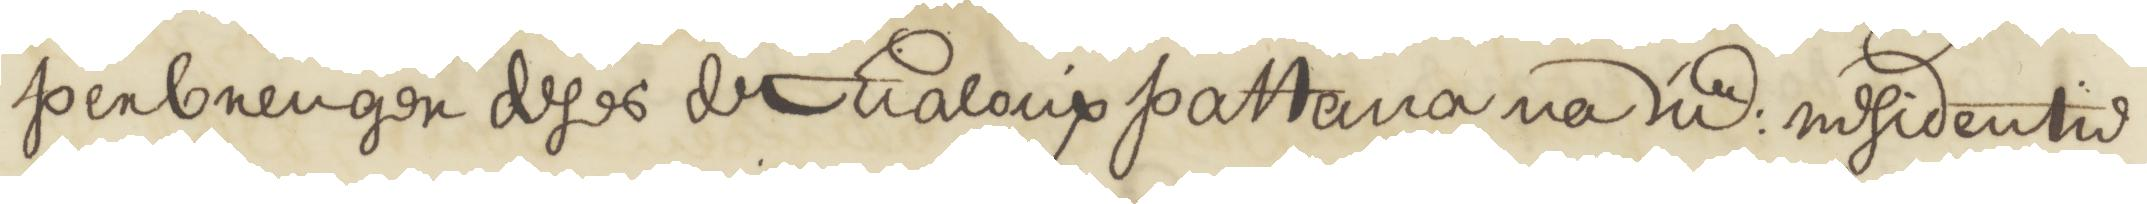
perbrenger deses de chialoup Pattana na VE: residentie
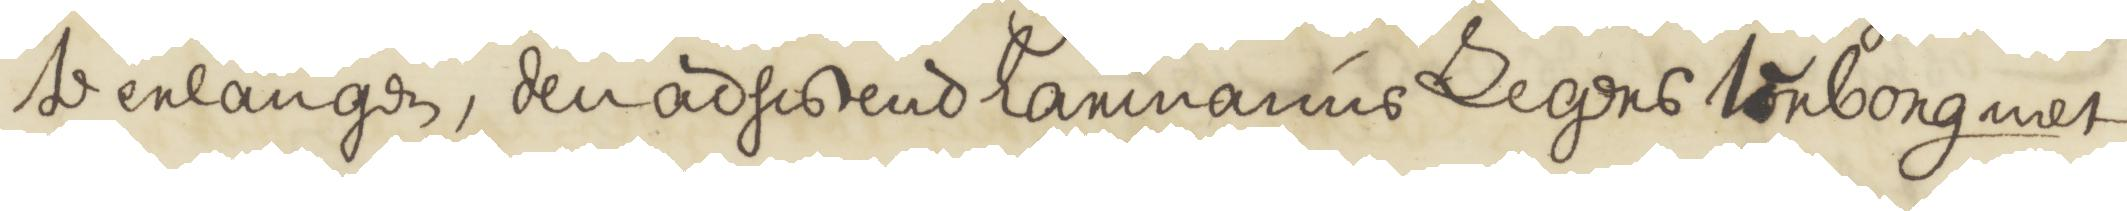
te erlangen, den adsistend harmanus Zegers terborg met
